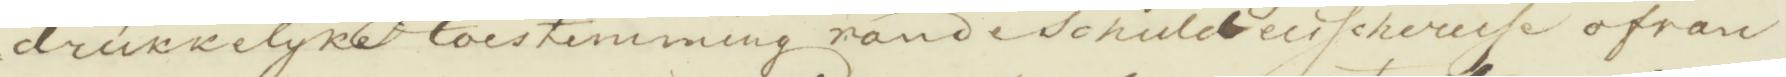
drukkelyke toestemming vande schuld eisscheresse ofvan
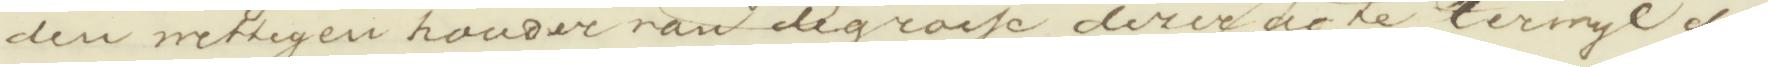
den wettigen houder van degrosse dezer acte terwyl de
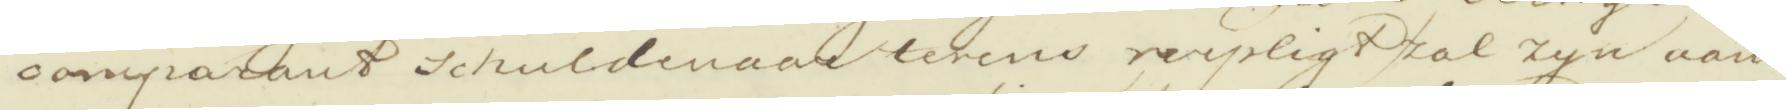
comparant schuldenaar tevens verpligt zal zyn aan
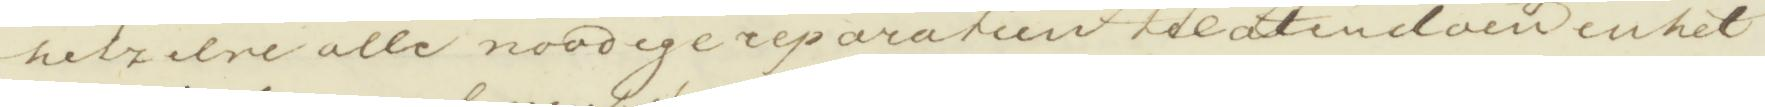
hetzelve alle noodige reparatien telatendoen enhet
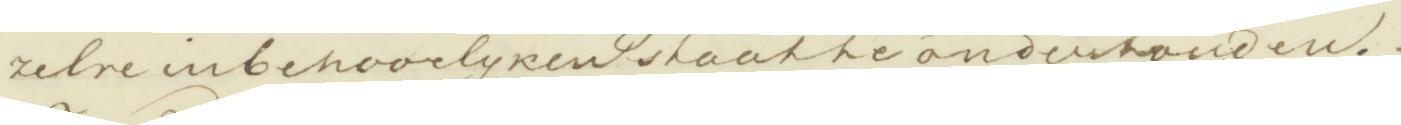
zelve inbehoorlyken staatte onderhouden.
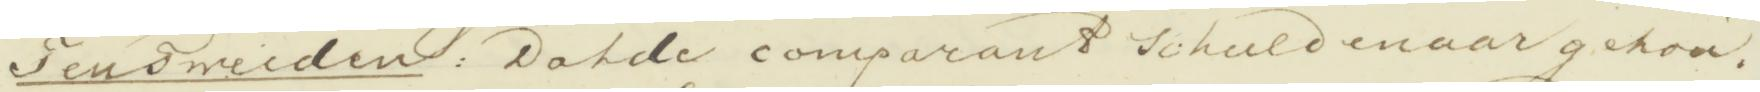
TenTweeden : Datde comparant schuld enaar gehou,
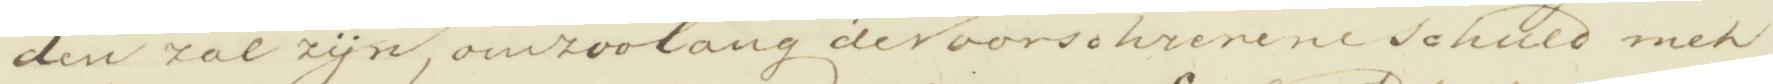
den zal zijn, omzoolang devoorschrevene schuld met
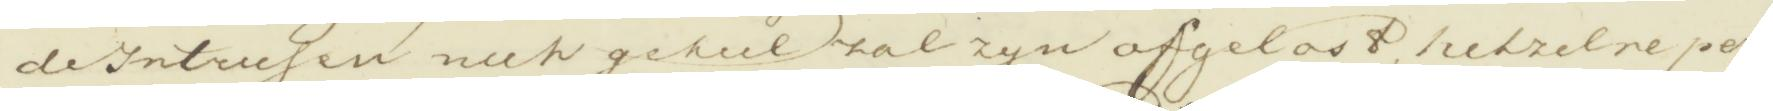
deIntressen niet geheel zal zyn afgelost, hetzelve per
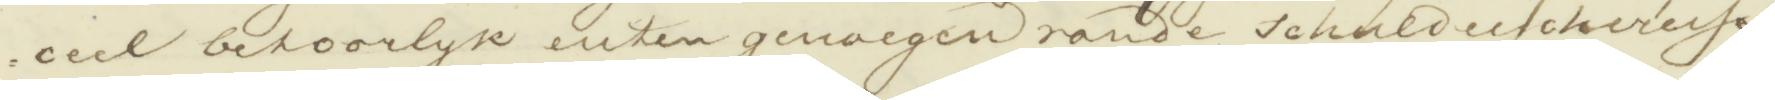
„ceel behoorlyk enten genoegen vande schuldeischeresse
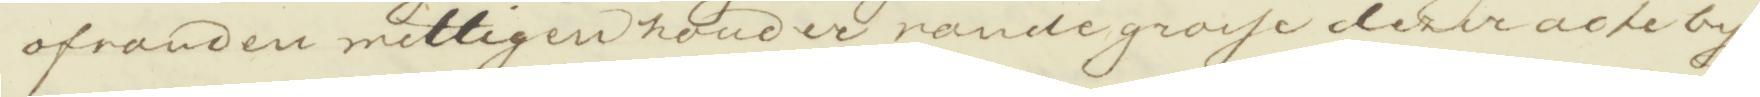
ofvanden wettigen houder vande grosse dezer acte by
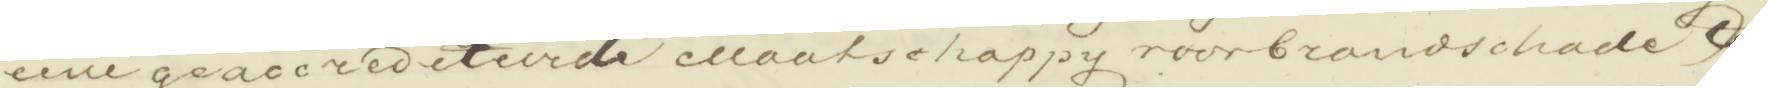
eene geaccrediteerde maatschappy voorbrandschade te
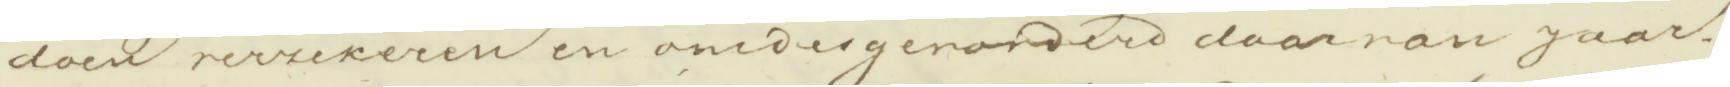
doen verzekeren en omdesgevorderd daar van jaar„
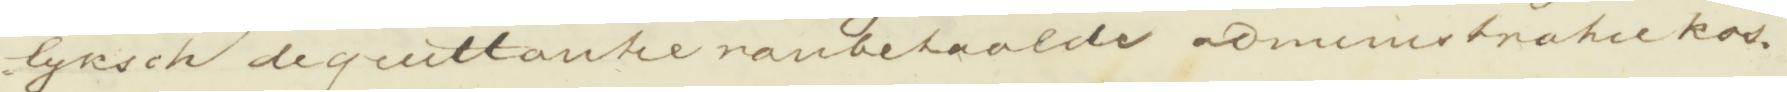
„lyksch de quittantie vanbetaalde administratie kos„
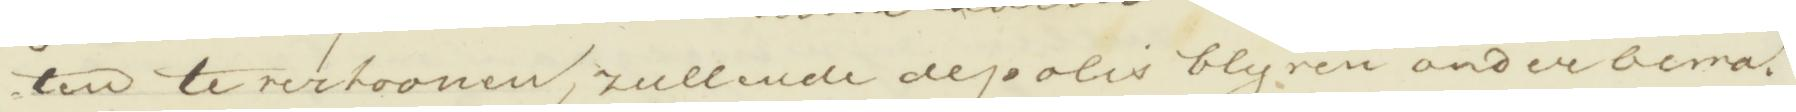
„ten te vertoonen, zullende depolis blyven onder bewa„
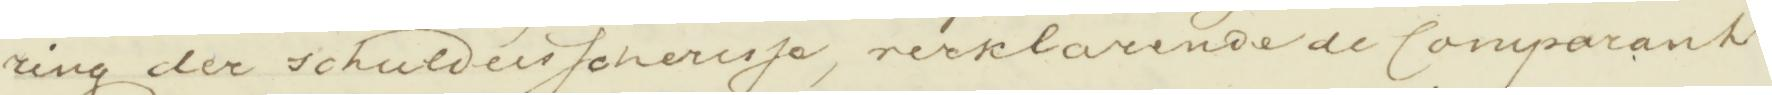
ring der schuldeisscheresse, verklarende de Comparant
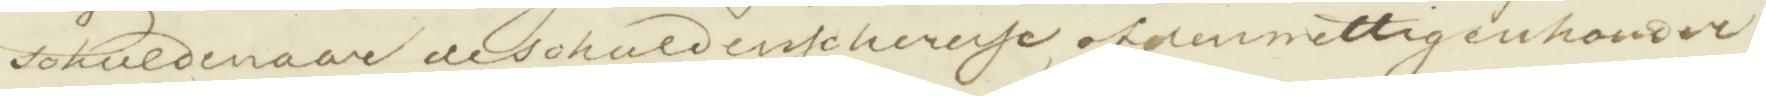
schuldenaar deschuldesscheresse of denwettig enhouder
